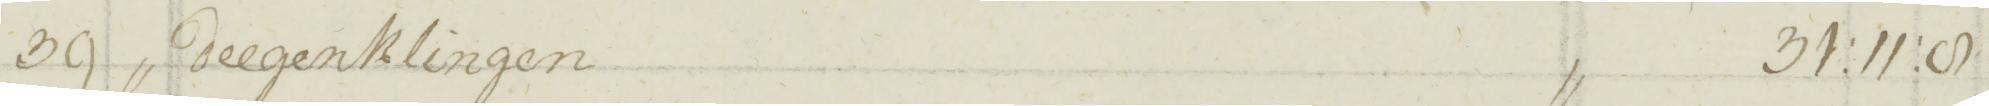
39 „ deegenklingen „ 31:11:8
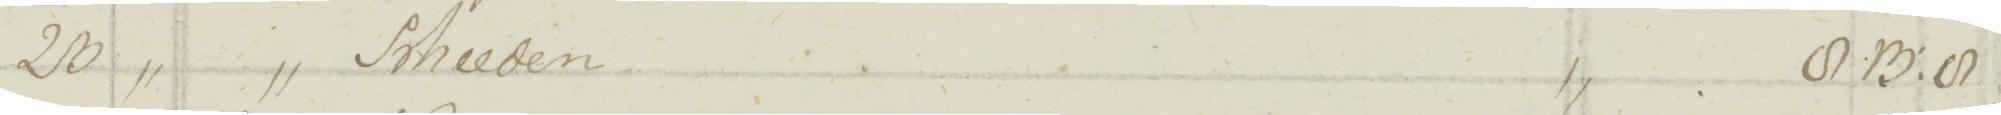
23 „ „ scheeden „ 8:13:8
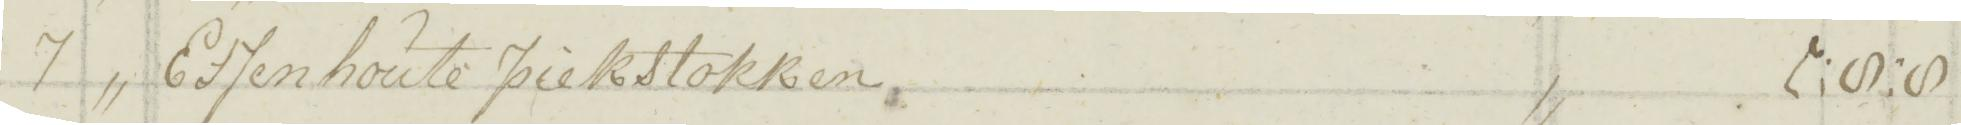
7 „ Essenhoute piekstokken „ 5:8:8
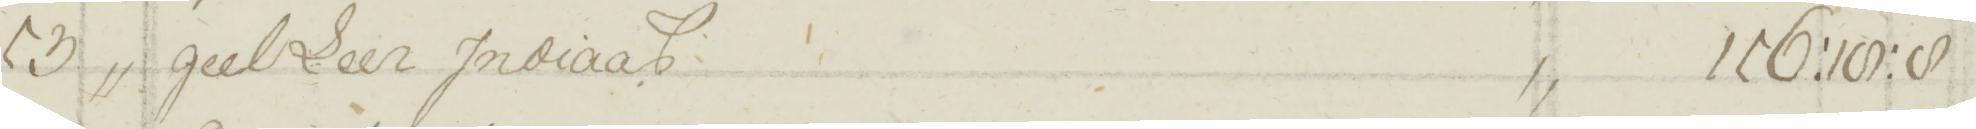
53 „ geel Leer Jndiaas „ 156:18:8
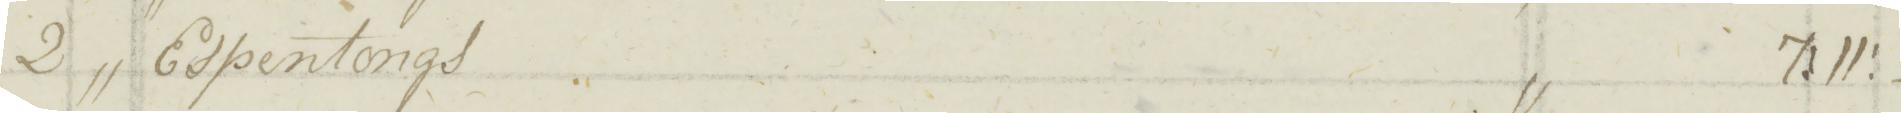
2 „ Espentongs „ 7:11:
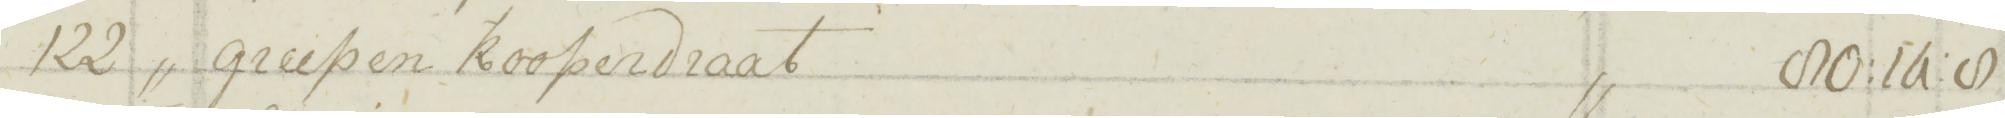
122 „ greepen kooperdraat „ 80:14:8
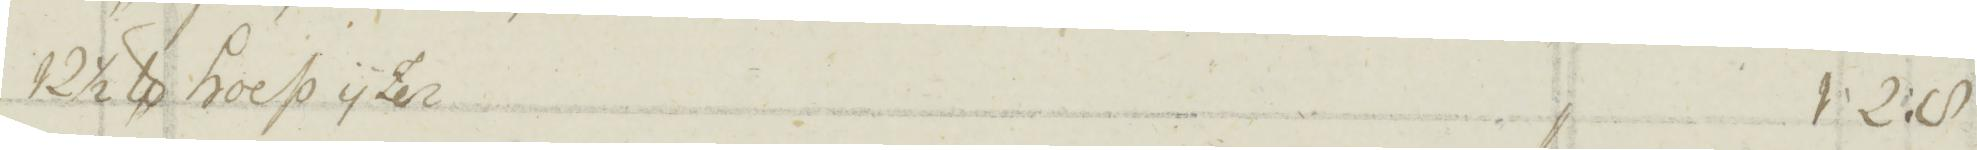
12½ lb hoep ijzer „ 1:2:8
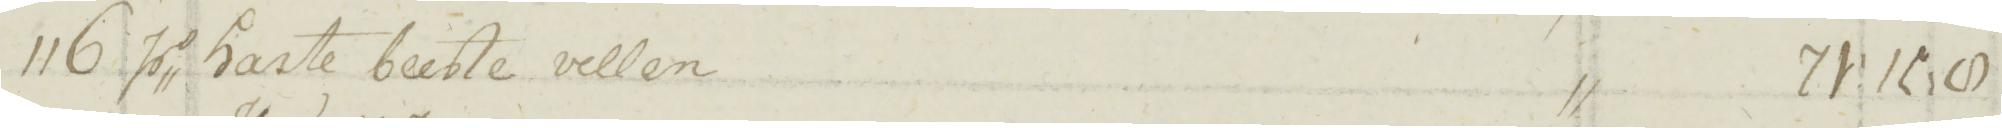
116 p„s harte beeste vellen „ 71:15:8
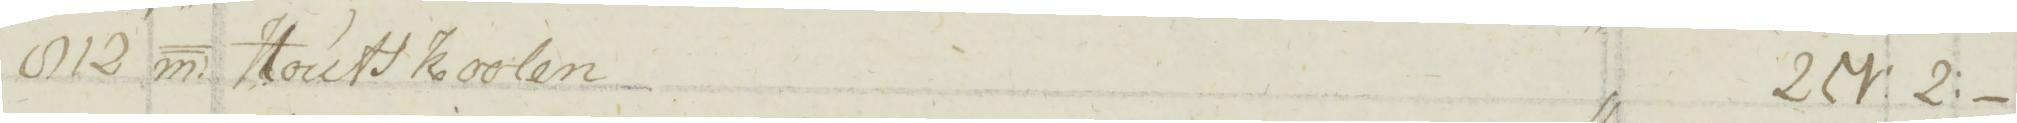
812 m: Houts koolen „ 251:2:_
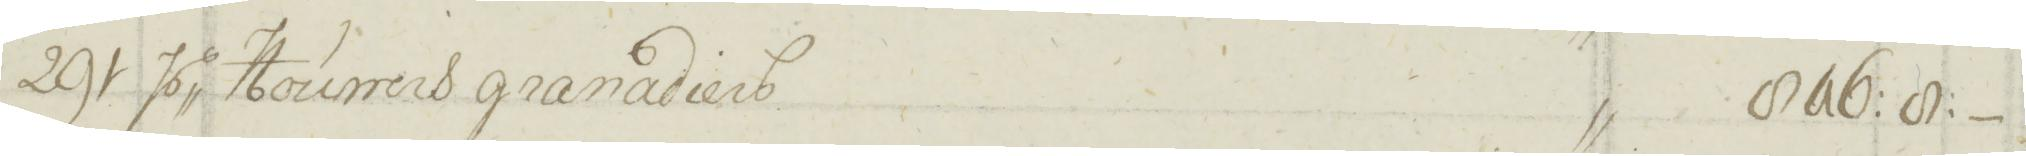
291 p„s Houwers granadiers „ 846:8:_
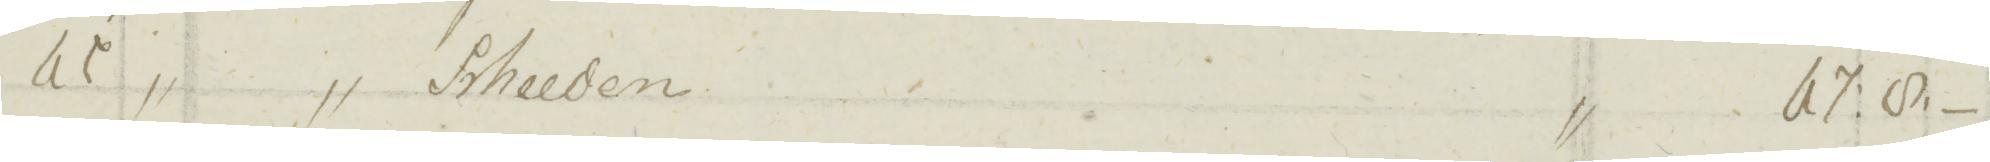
45 „ „ scheeden „ 47:8,_
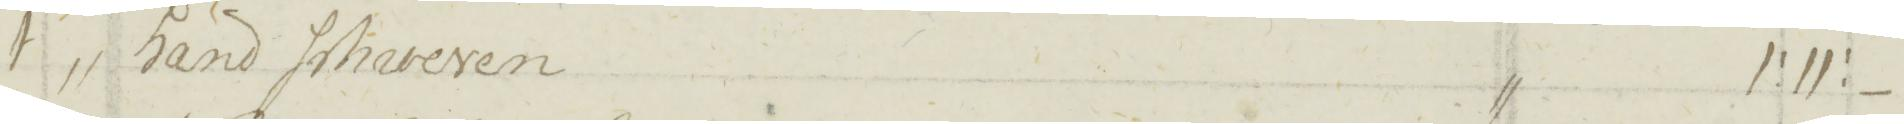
1 „ hand schroeven „ 1:11:_
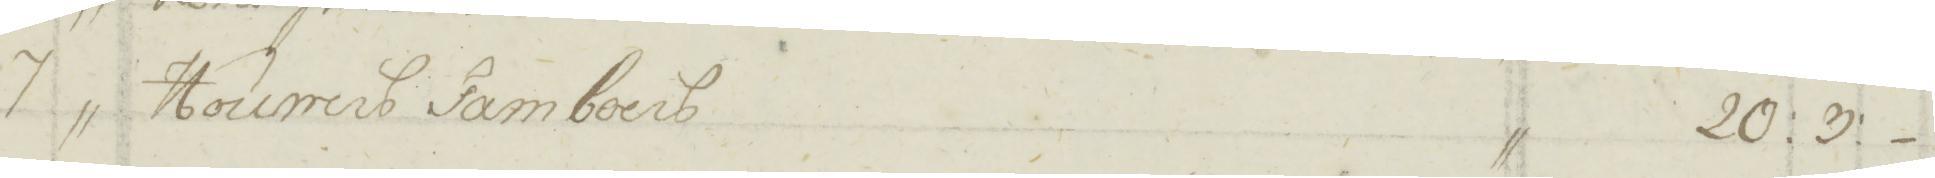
7 „ Houwers Tamboers „ 20:3:_
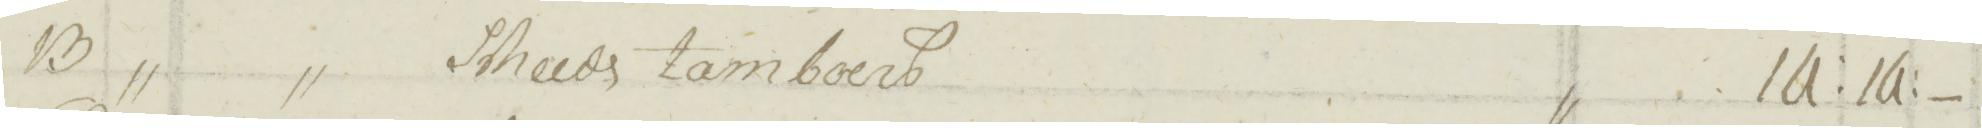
13 „ „ scheeden tamboers „ 14:14:_
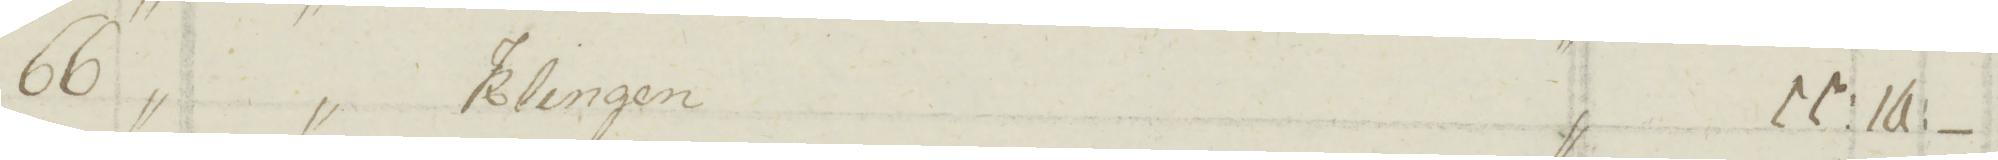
66 „ „ klingen „ 55:14:_
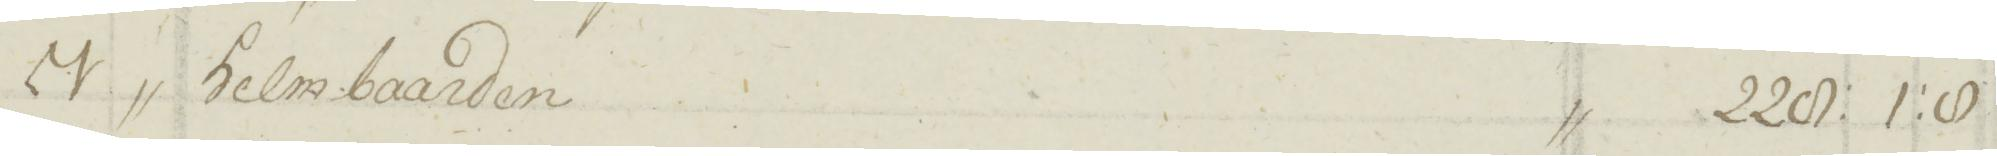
51 „ helm .baarden „ 228:1:8
